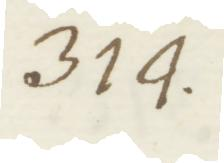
314.
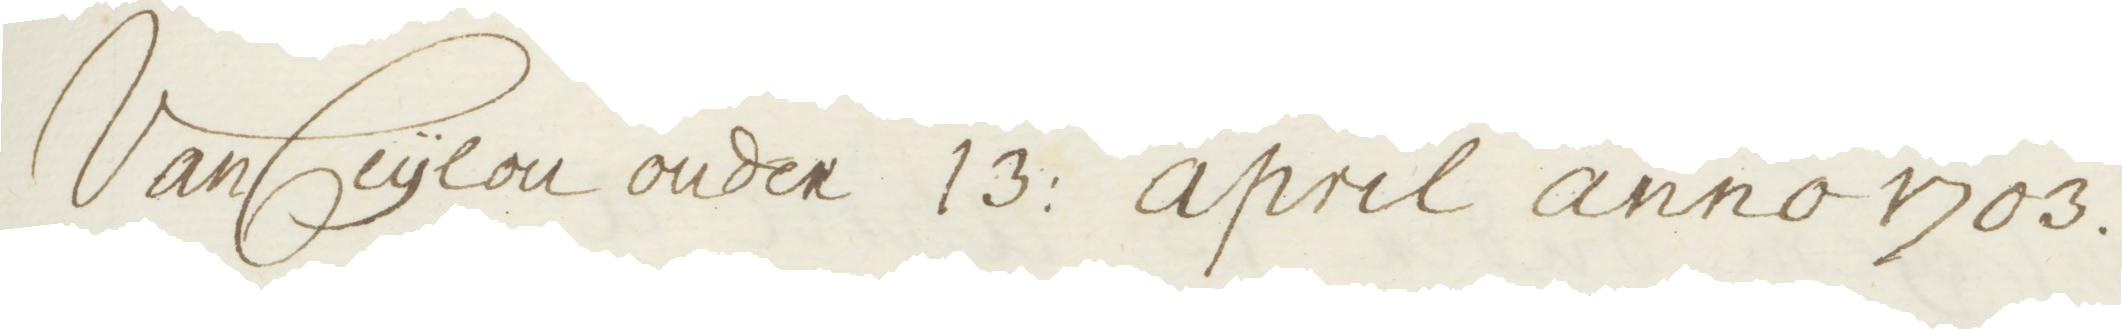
Van Ceijlon onder 13: april anno 1703.
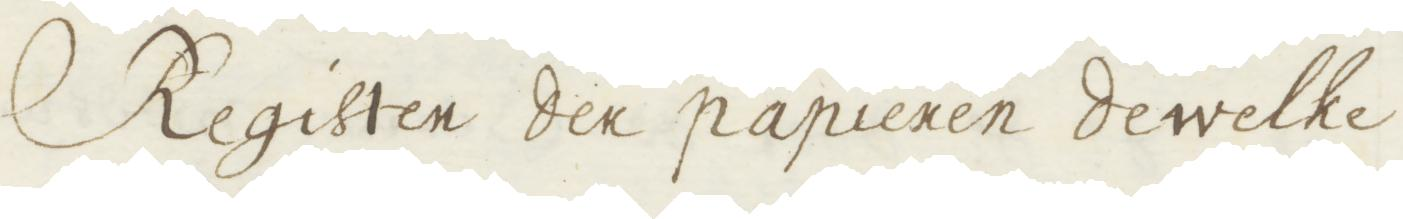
Register der papieren dewelke
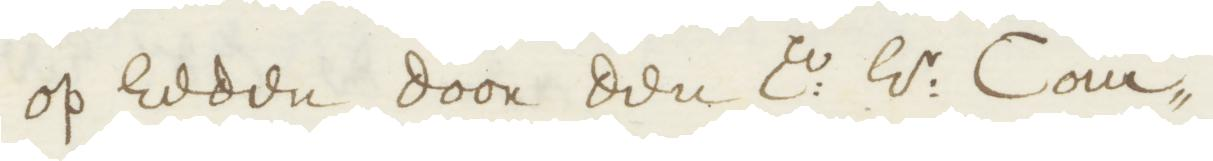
op heden door den E: h:r Com„
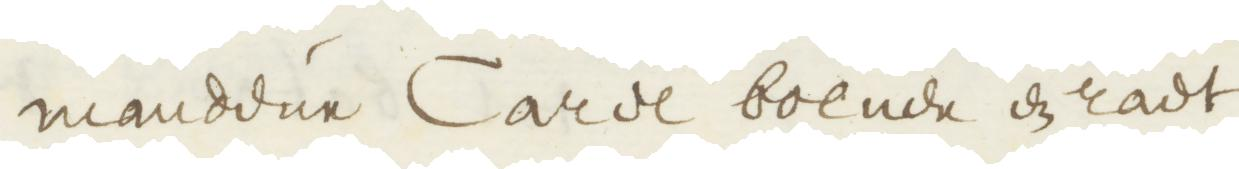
mandeur Carel bolner en raet
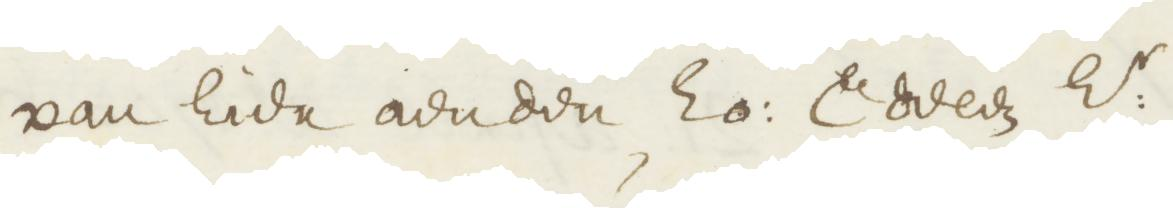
van hier aen den ho: Edelen h:r
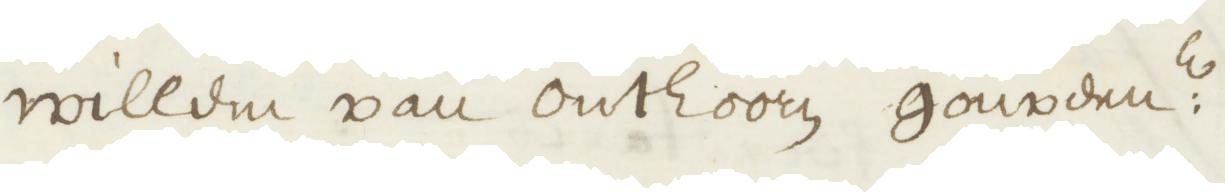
willem van outhoorn gouvern:'
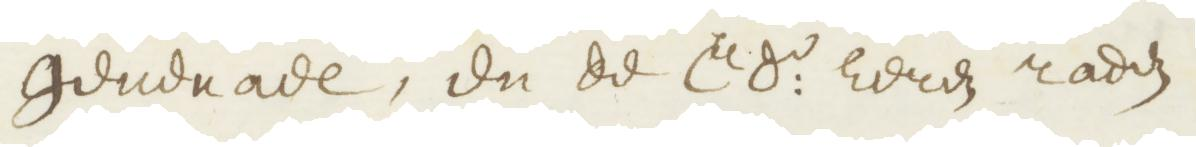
generael, en de Ed:e heren raden
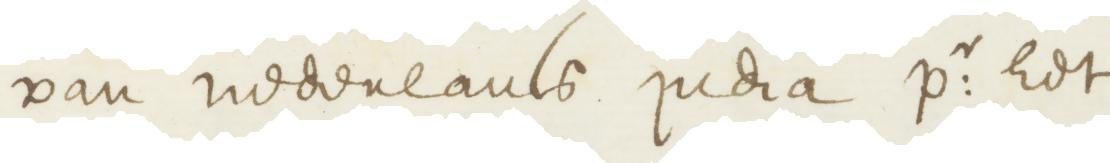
van nederlants jndia p:r het
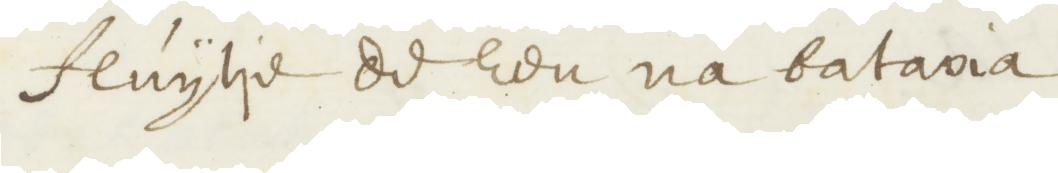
fluijtje dehen na batavia
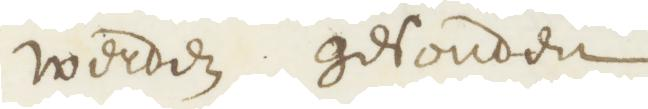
werden gesonden
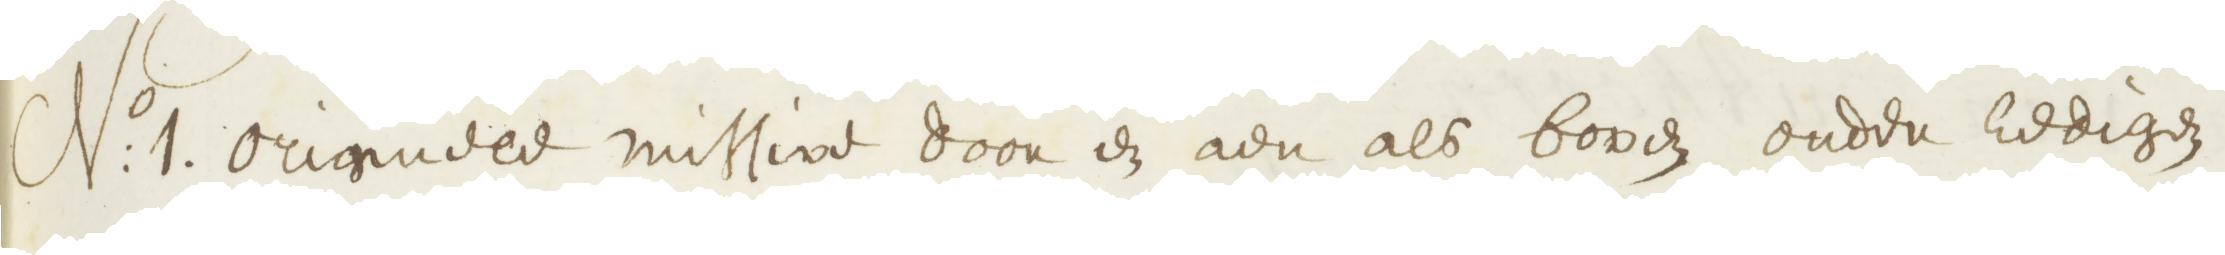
N:o 1. Originele missive door en aen als boven onder hedigen
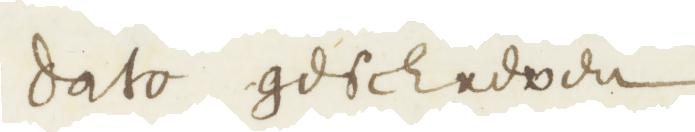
dato geschreven
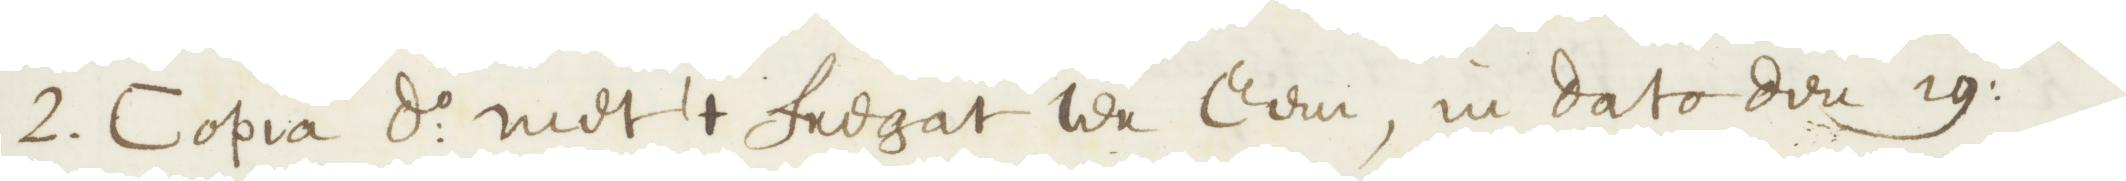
2. Copia d:o met ’t fregat ter Eem, in dato den 19:e
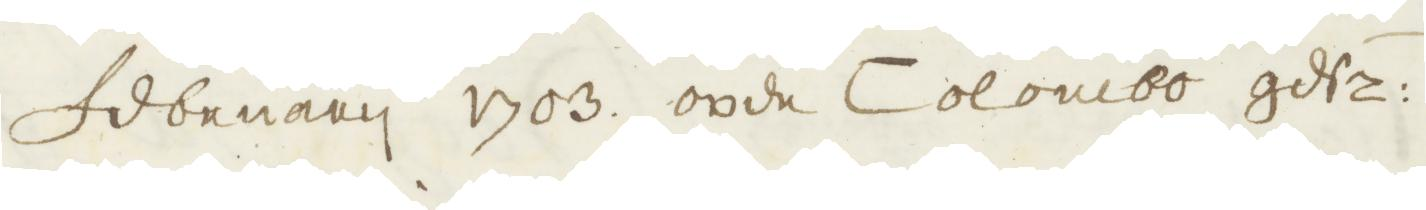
februarij 1703. over Colombo gesz:
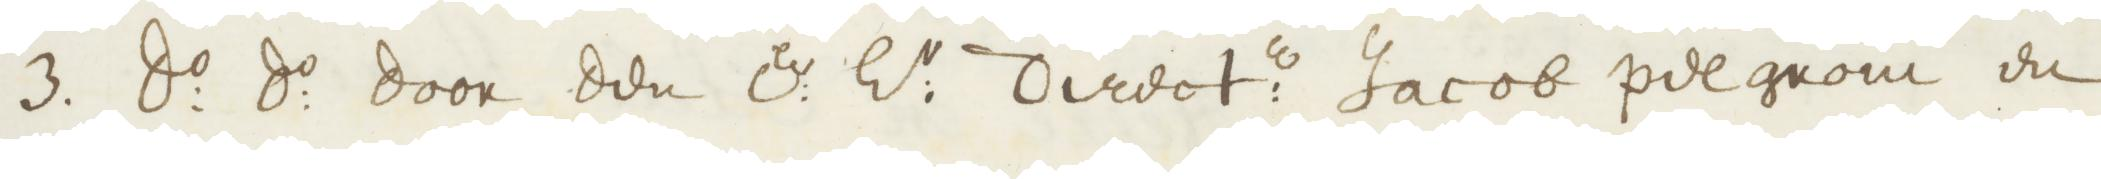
3. d:o d:o door den E: h:r direct:' Jacob pelgrom en
